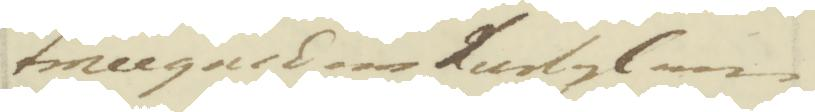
twee guldens Veertig Cent
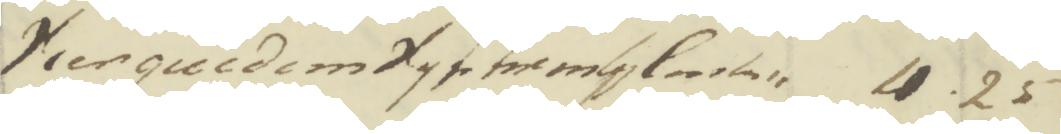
Vier guldens Vyf en twintig Cent „ 4. 25
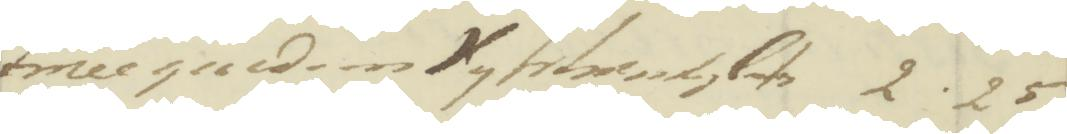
twee guldens Vyf en twintig Cent 2. 25
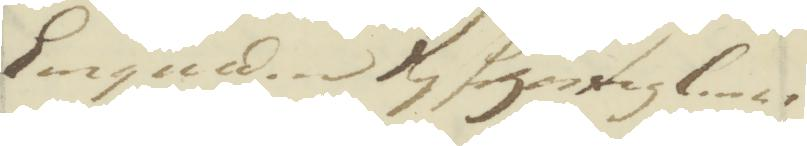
Een gulden Vyf en zestig Cent „
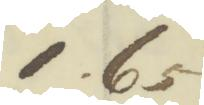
1. 65
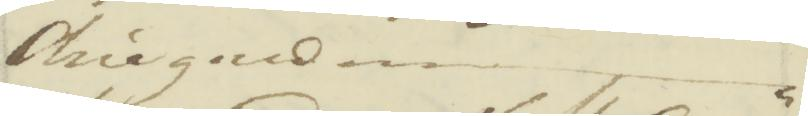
drie guldens „
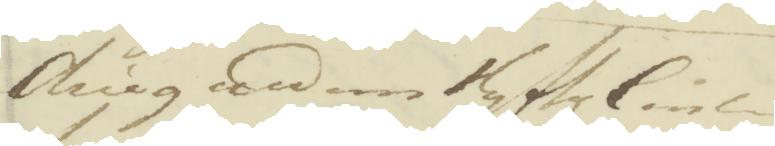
drie guldens Vyftig Cent
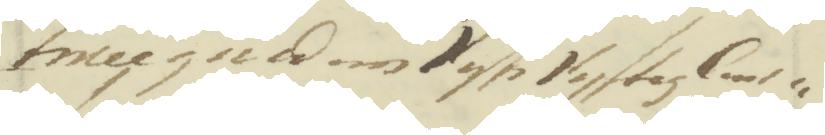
twee guldens Vyf en Vyftig Cent „
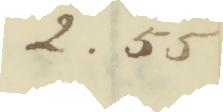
2. 55
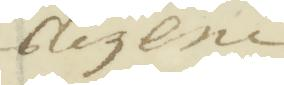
Dezlve
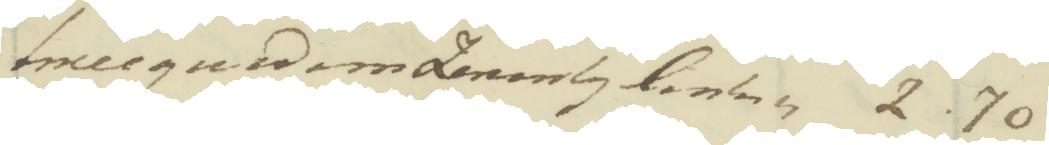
twee guldens Zeventig Cent „ 2. 70
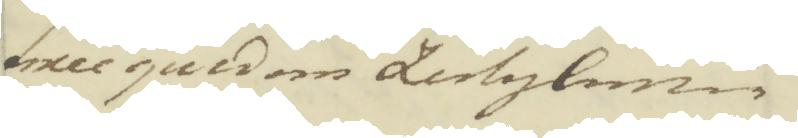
twee guldens Zestig Cent
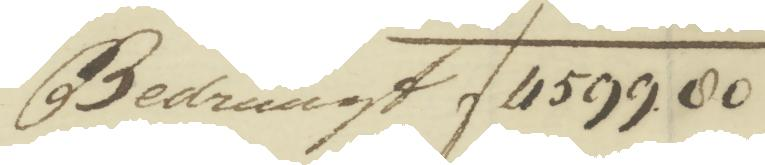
Bedraagt ƒ 4599. 80
